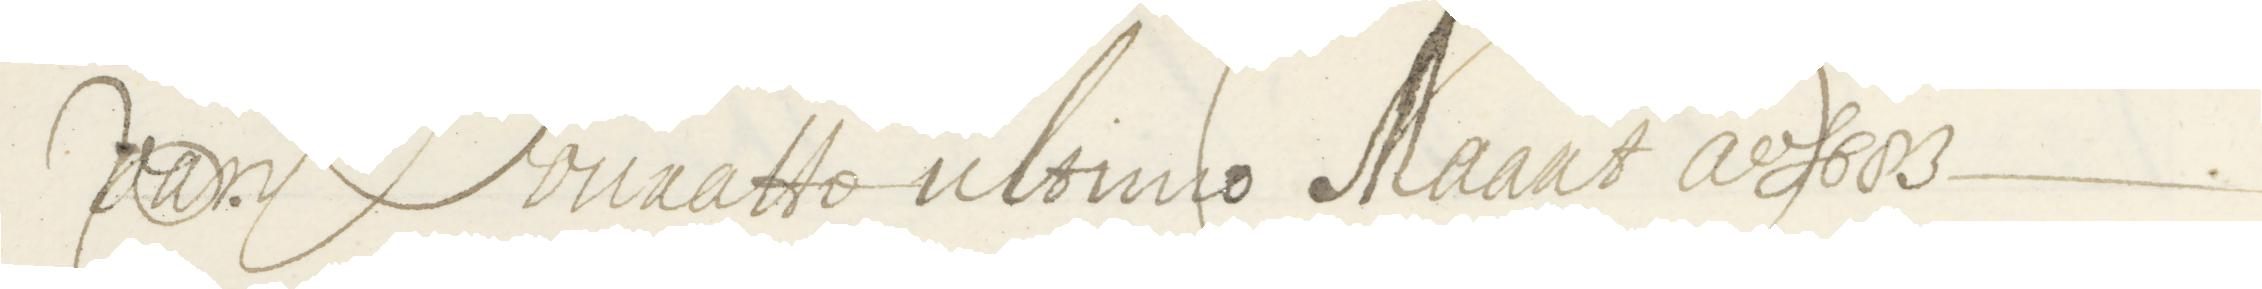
Van Souratto ultimo Maart ao1683 —.
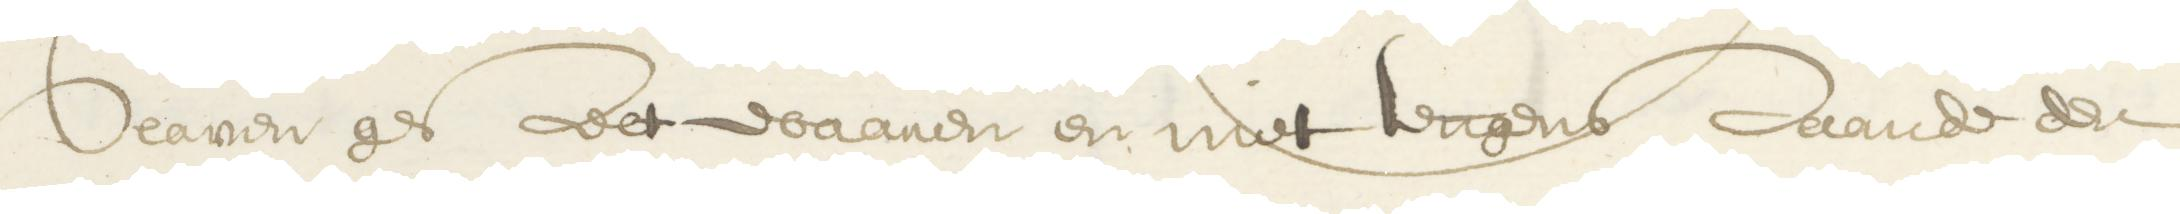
slaven gestelt waaren en niet tengenstaande den
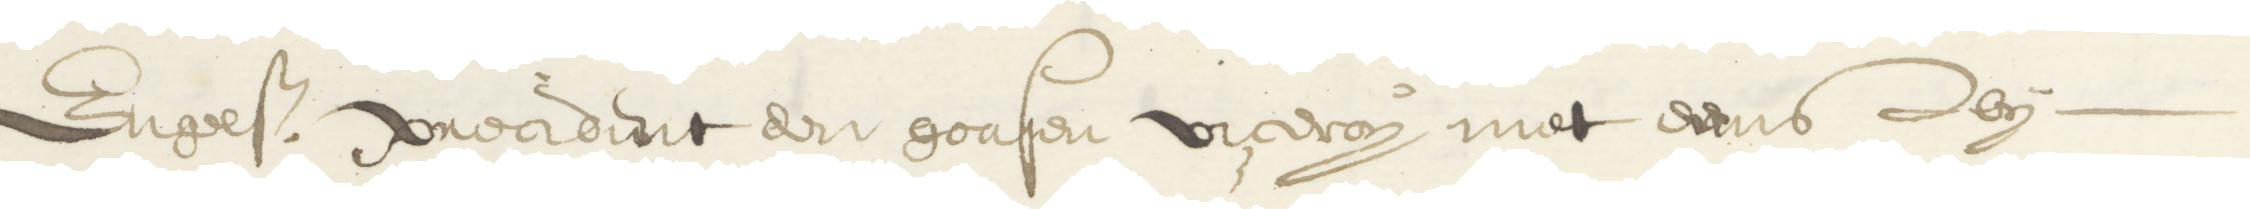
Engels. preadint der goasen viceroij niet eens bij —
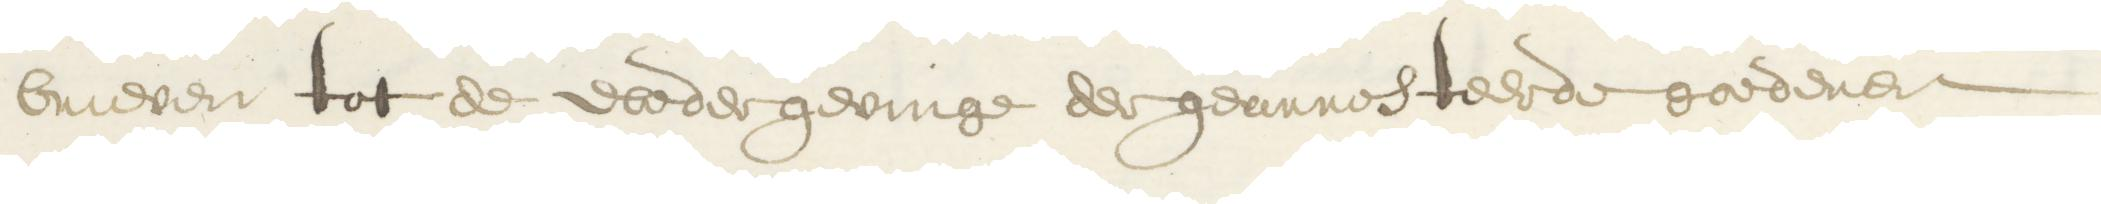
brieven tot de wedergevinge der gearresteerde goederen
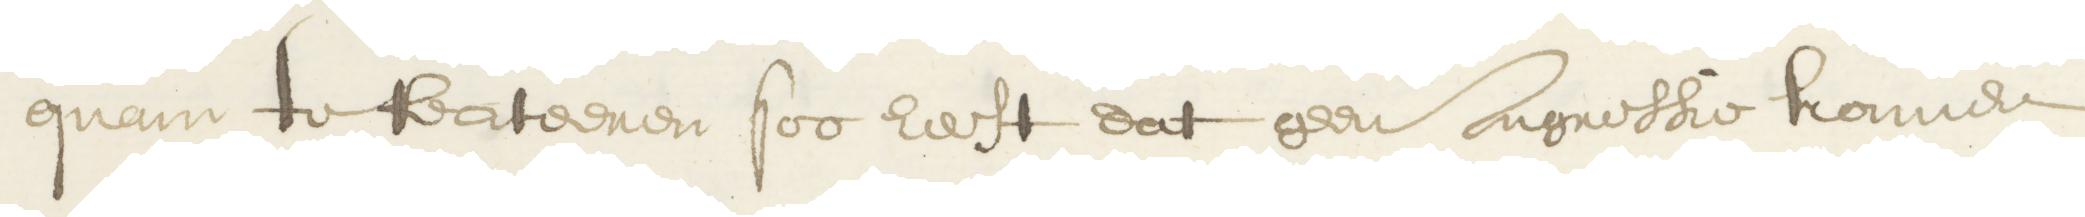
quam te feciteeren soo heeft dat geen Ingressie konnen
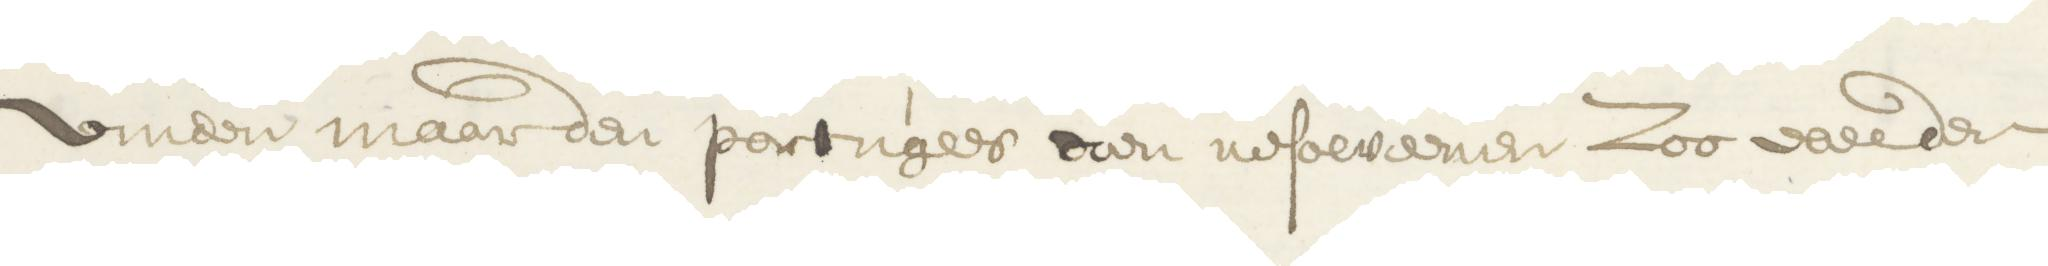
vinden maar den portugees doen resolveeren zoo wel den
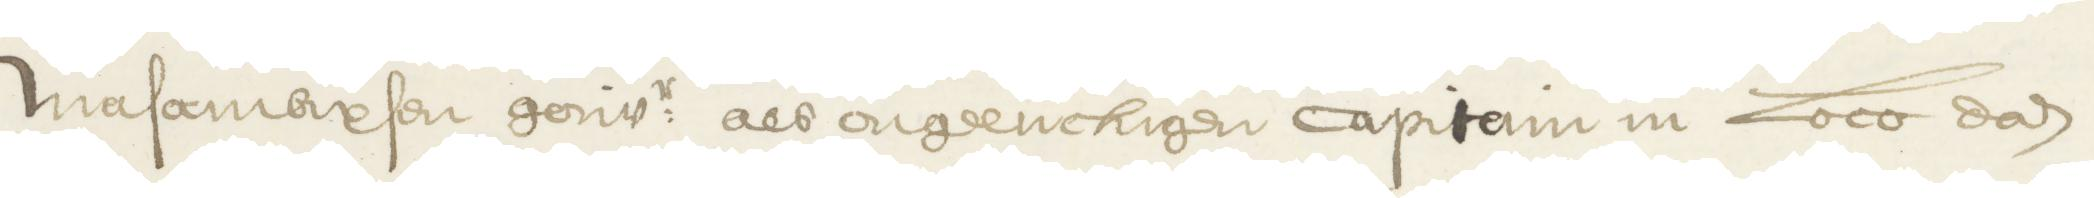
masamaxsen gouv:r als ongeluckigen capitain in loco doen
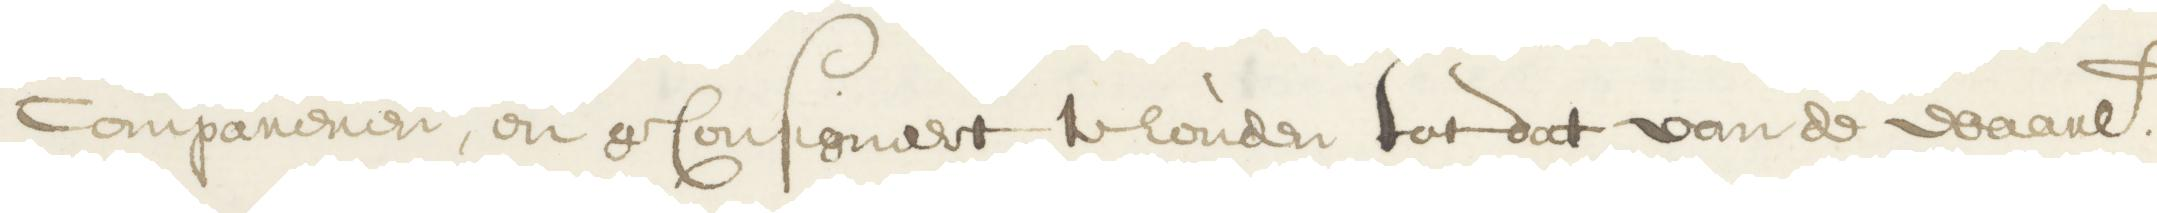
compareren, en geconsigneert te houden tot dat van de waare
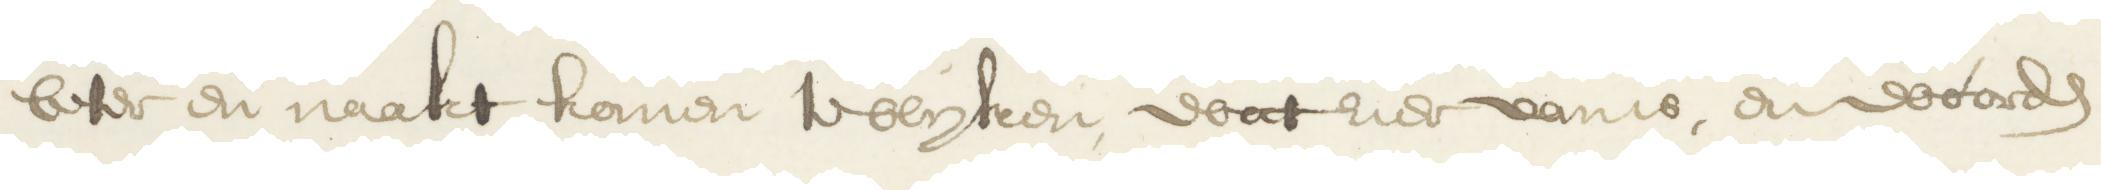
beter en naakt komen teblijken, wat hier van is, en woorden
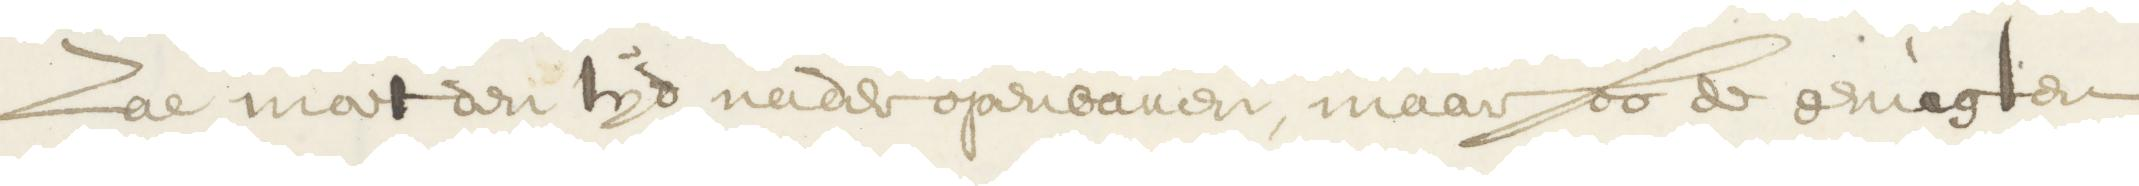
zal moet den tijd nader openbaren, maar soo de gemagten
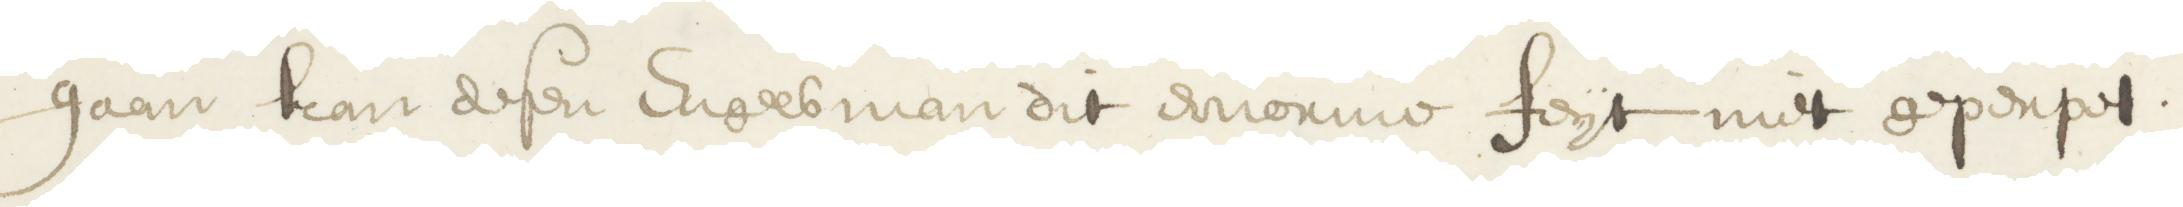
gaan kan desen Engelsman dit enorme feijt niet geperpet.
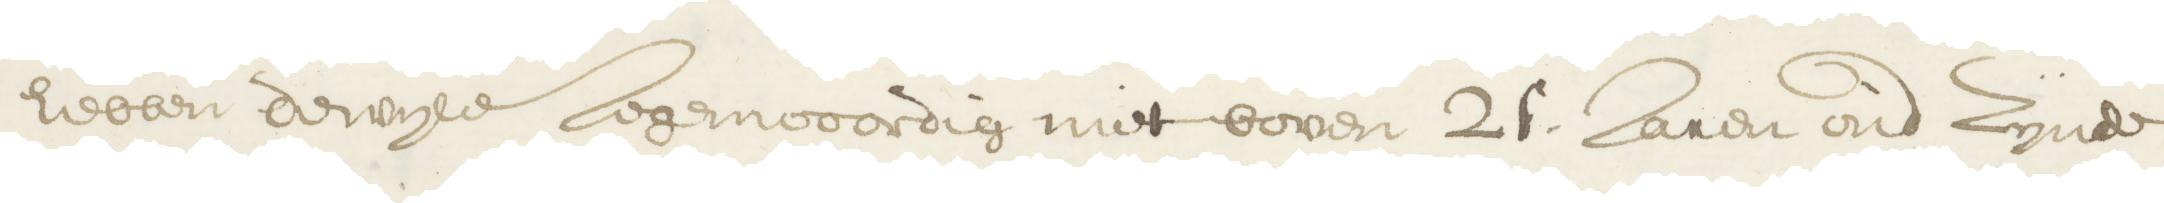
hebben dewijle Iegenwoordig niet boven 25. Iaren oud zijnde
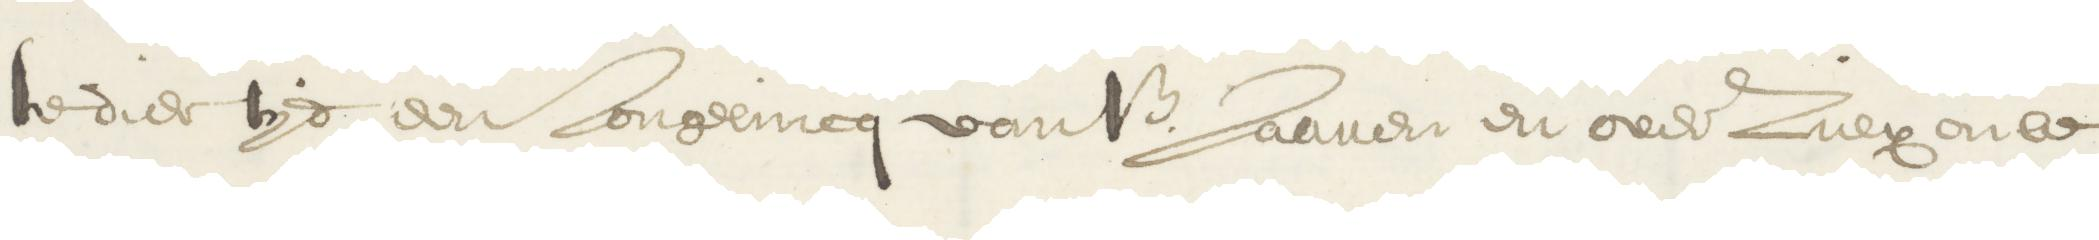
te dier tijd een Iongelincq van 13. Jaaren en overzulx onbe
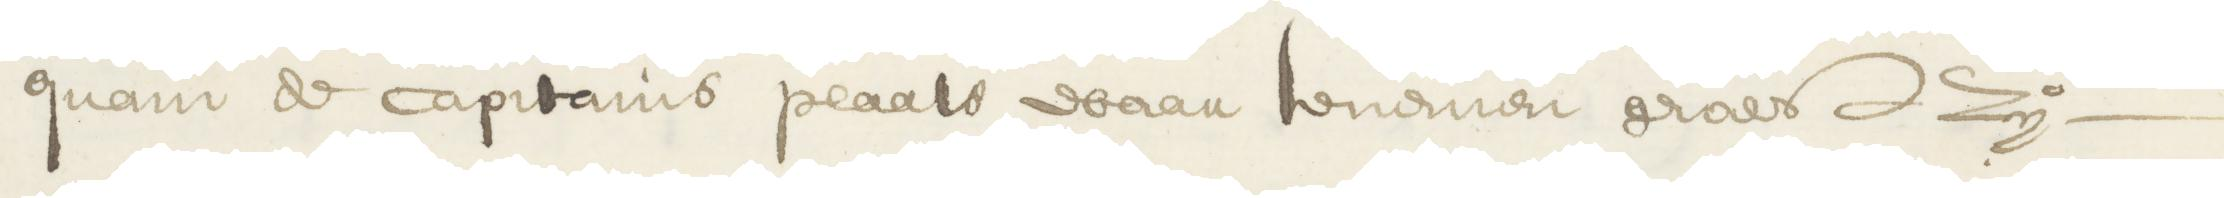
quam de capitains plaats waar tenemen gewest zij —
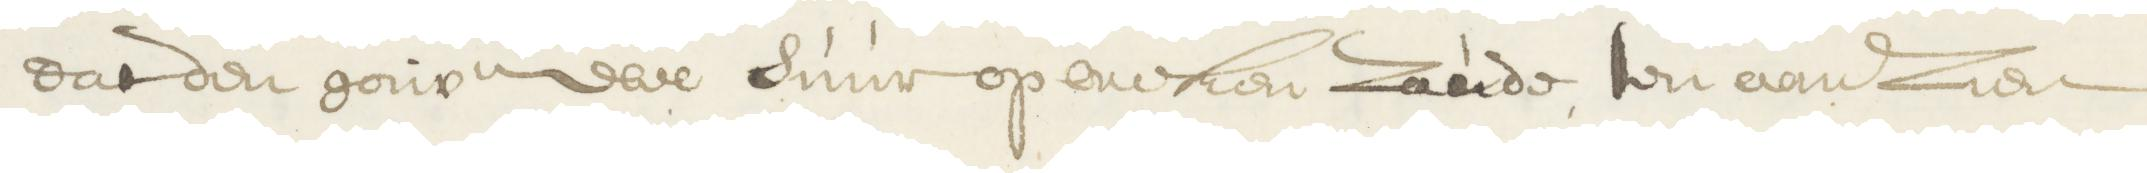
dat den gouvr wel suur op breken zoude, ten aanzien
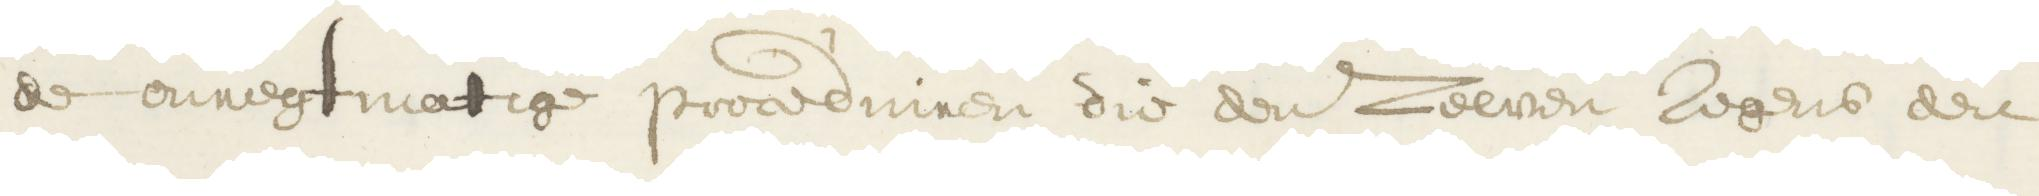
de onregtmatige proceduiren die den zelven Iegens den
